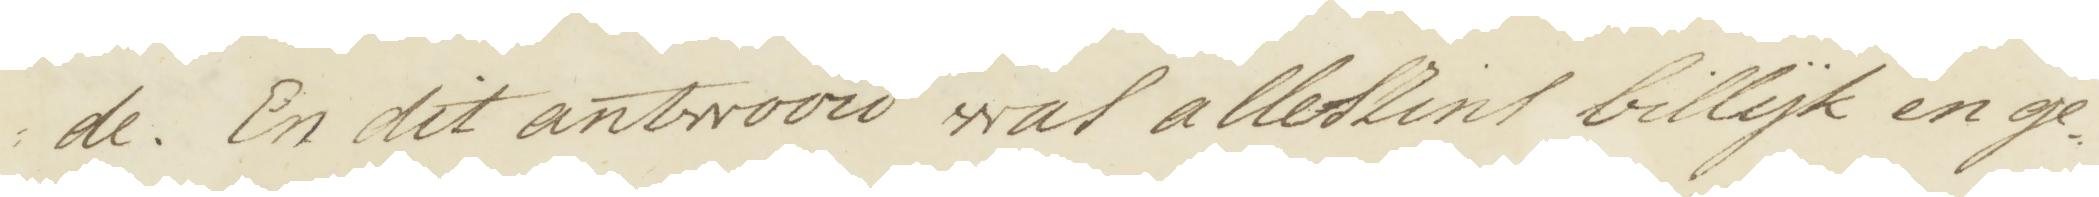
„de. En dit antwoord was alleszins billijk en ge„
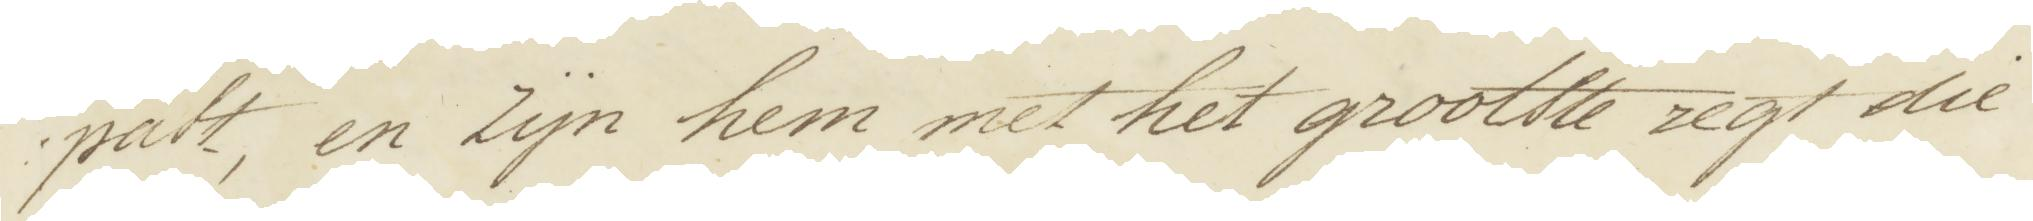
„past, en zijn hem met het grootste regt die
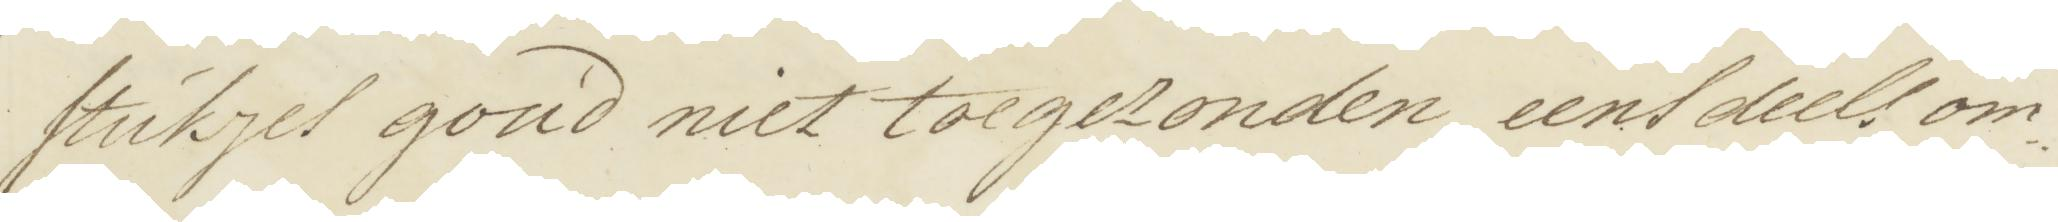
stukjes goud niet toegezonden, eens deels, om„
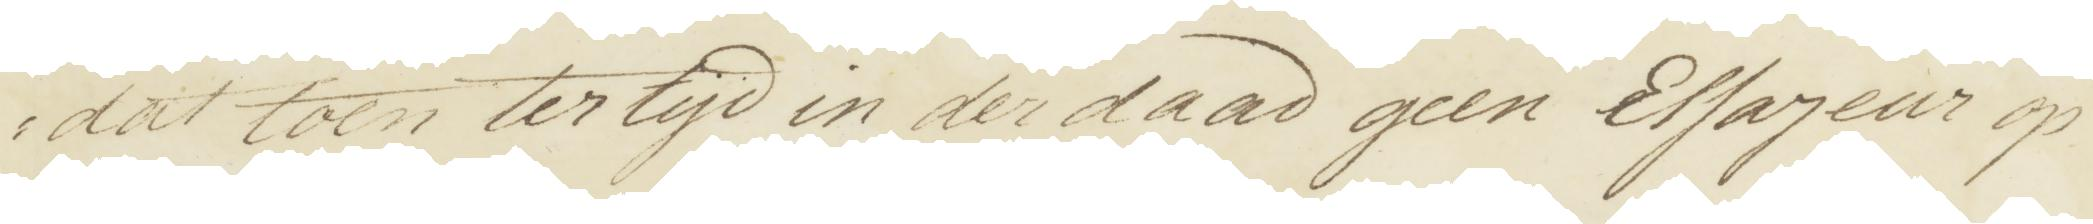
„dat toen ter tijd in der daad geen Essajeur op
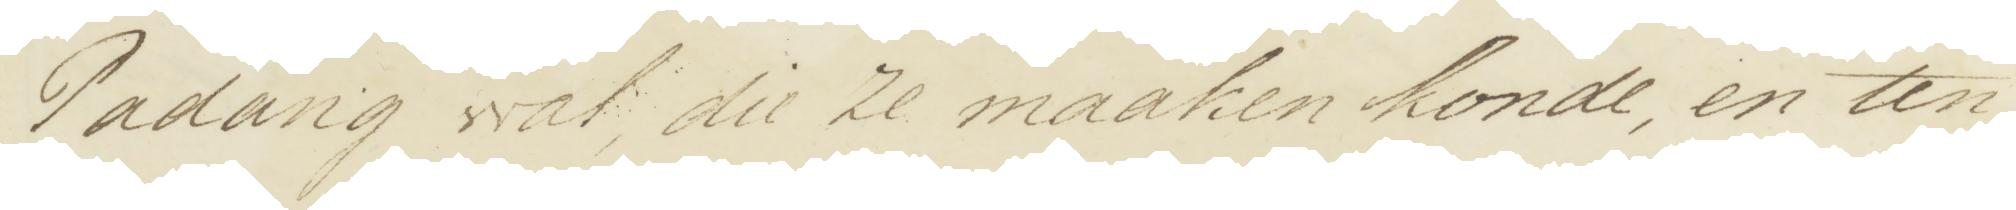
Padang was, die ze maaken konde, en ten
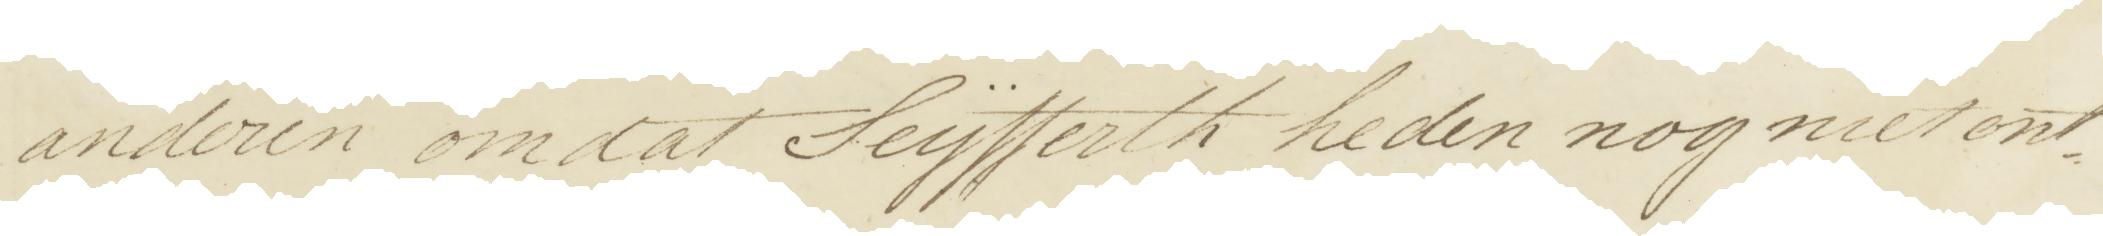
anderen om dat seijfferth heden nog niet ont„
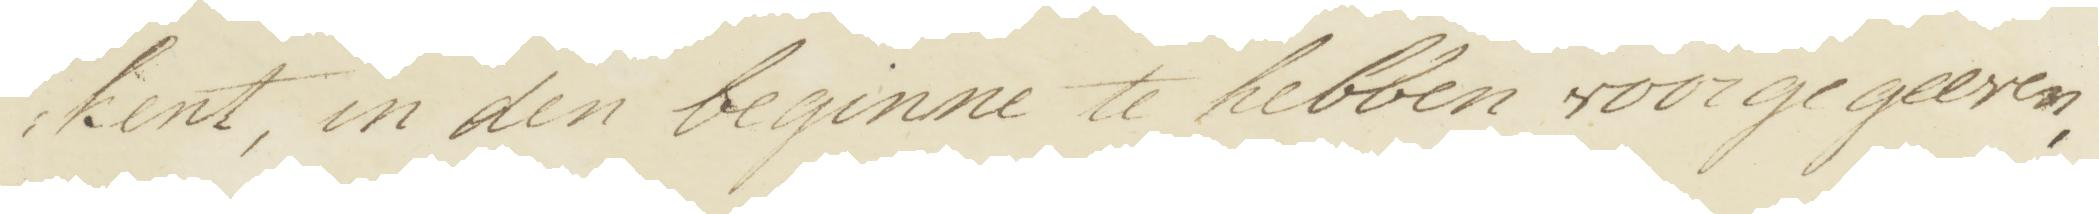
„kent, in den beginne te hebben voorgegeeven,
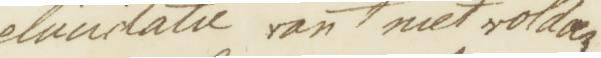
elucidatie van 't niet voldan
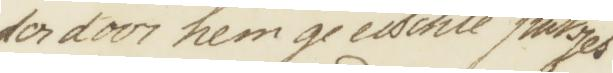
der door hem geeischte stukjes
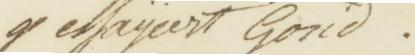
ge essaijeert goud.
